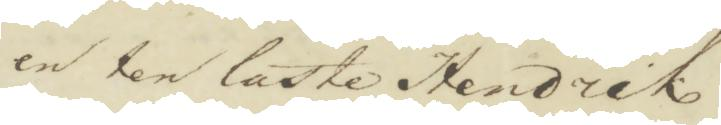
en ten laste Hendrik
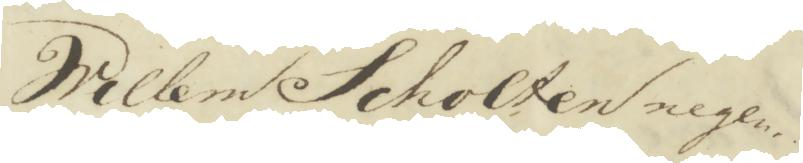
Willem Scholten negen,
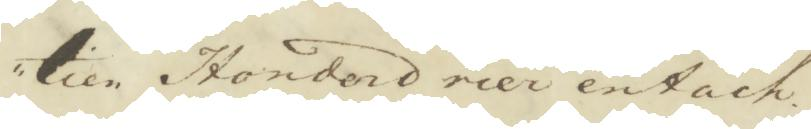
„tien Honderd vier en tach.
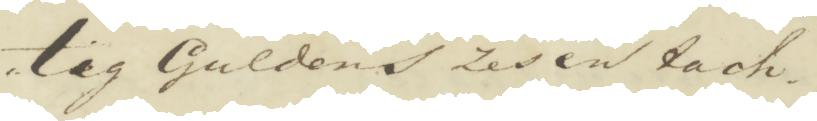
„tig Guldens zes en tach,
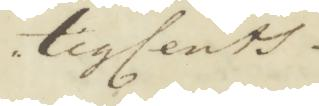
„tig Cents
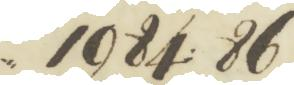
ƒ1984:86
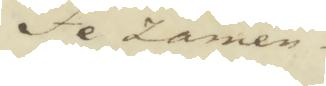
Te zamen
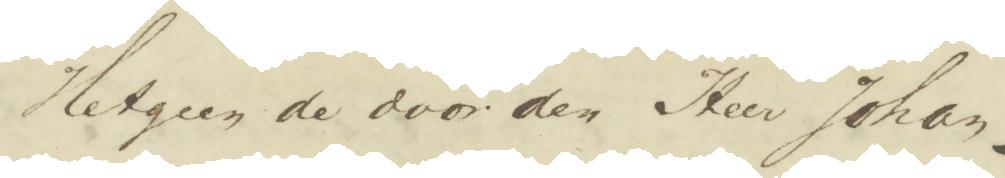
Hetgeen de door den Heer Johan,
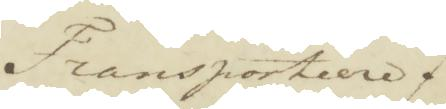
Transporteerd ƒ
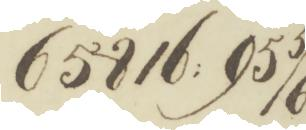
65816:93 5/6
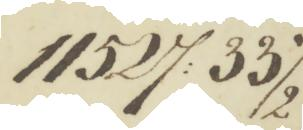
11527: 33½
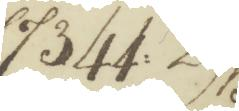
77344: 29 1/3
